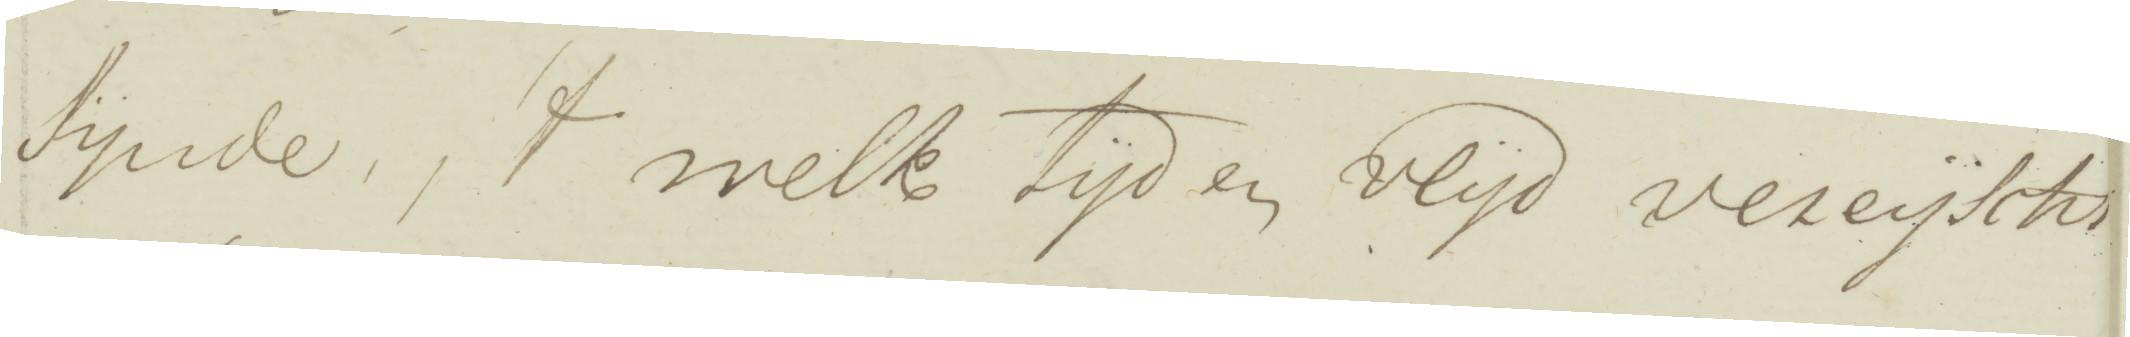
sijnde, 't welk tijd en vlijd vereijscht
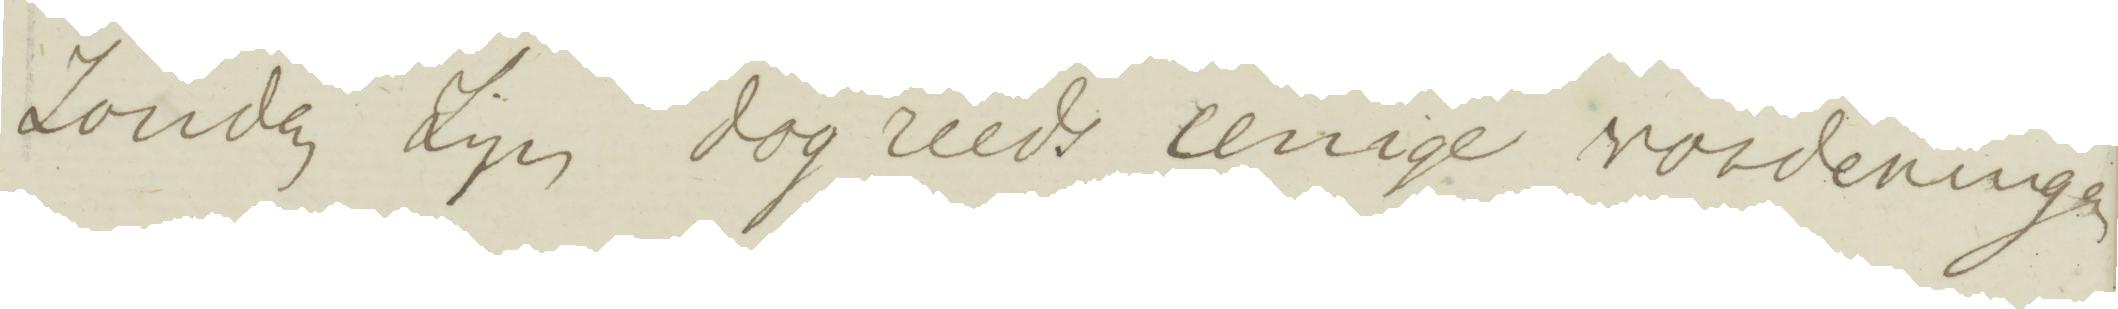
zouden zijn dog reeds eenige vorderingen
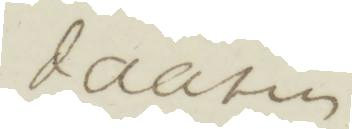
daarin
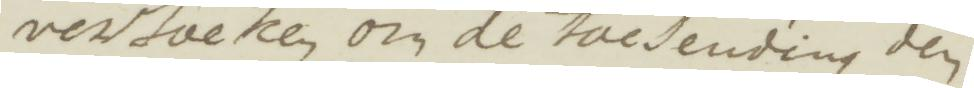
verzoeken om de toesending den
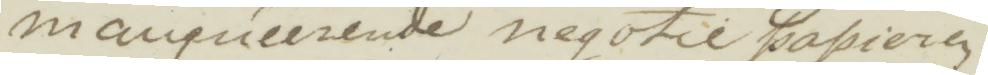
manqueerende negotie papieren
